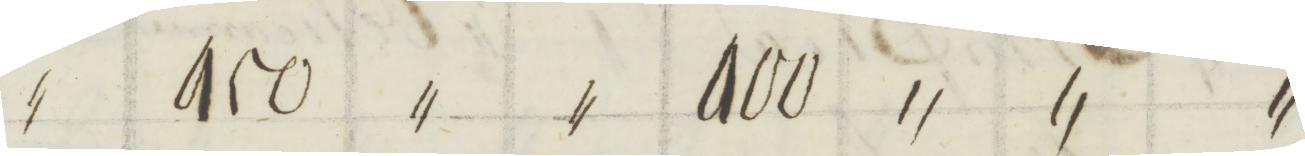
„ 450 „ „ 400 „ „ „
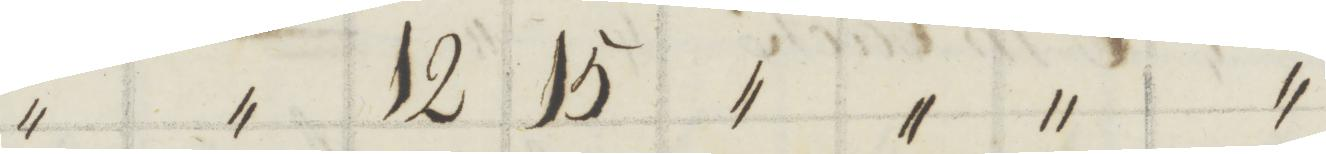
„ „ 12 15 „ „ „ „
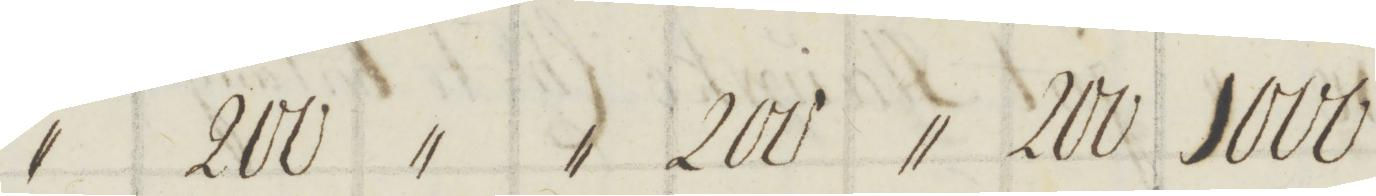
„ 200 „ „ 200 „ 200 1000
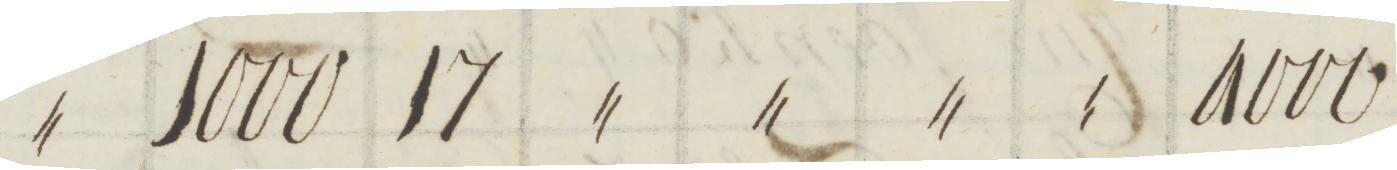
„ 1000 17 „ „ „ „ 4000
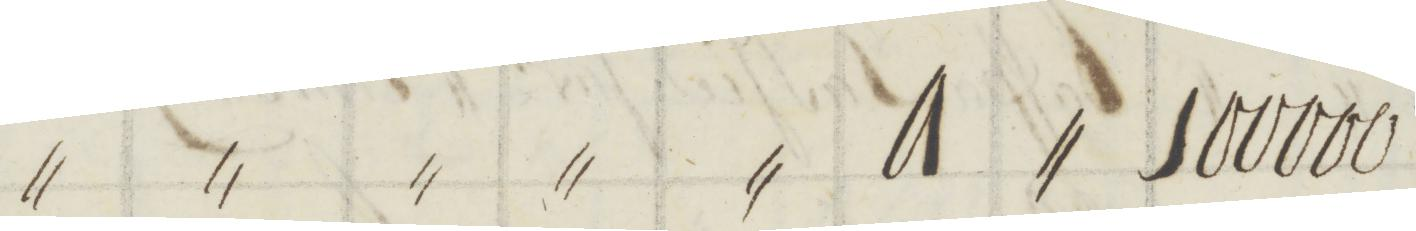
„ „ „ „ „ 4 „ 100000
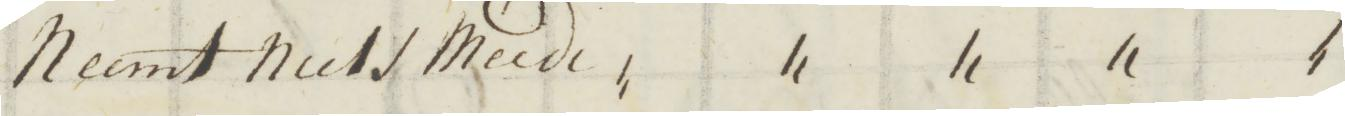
Neemt niets meede „ „ „ „ „
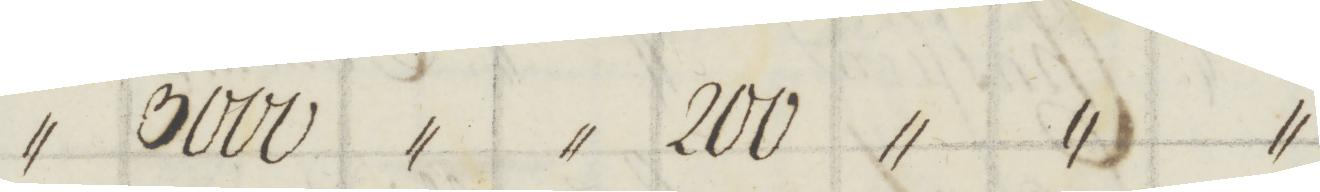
„ 3000 „ „ 200 „ „ „
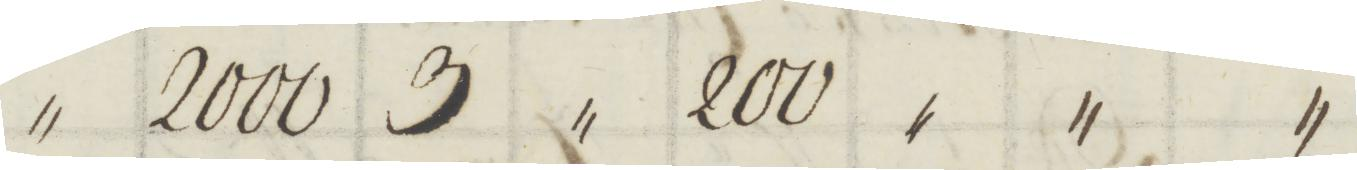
„ 2000 3 „ 200 „ „ „
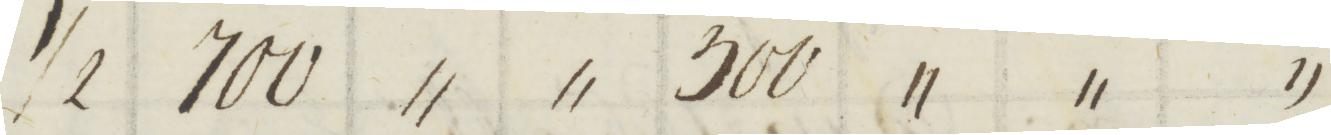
½ 700 „ „ 300 „ „ „
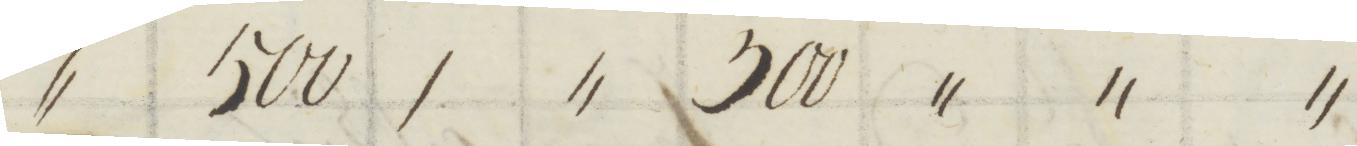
„ 500 1 „ 300 „ „ „
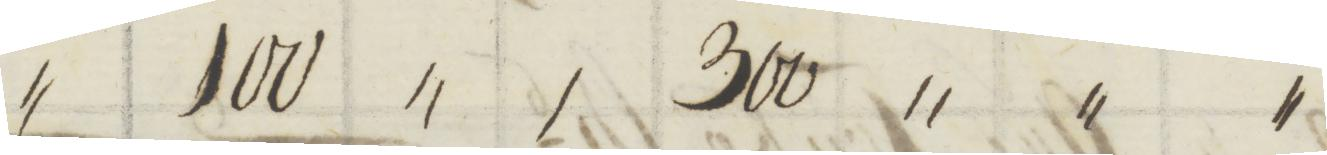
„ 100 „ 1 300 „ „ „
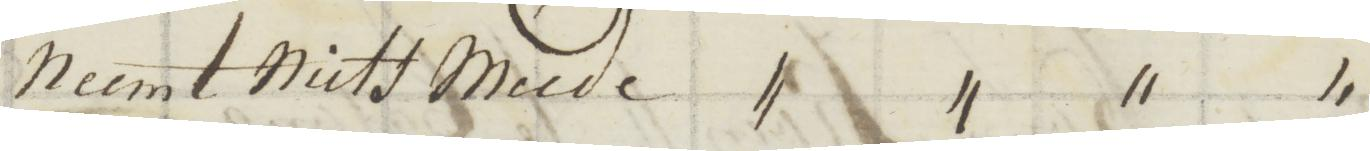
neemt niets meede „ „ „ „
